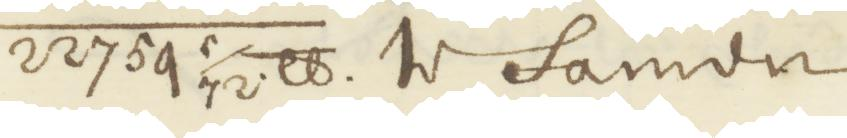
22754 5/72. lb. te samen
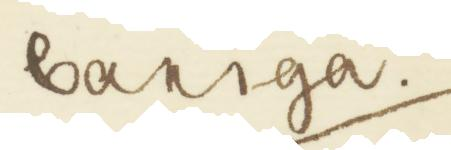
bariga.
